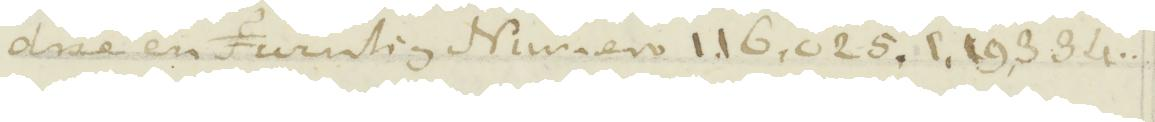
drie en Twintig Numero 1,16,025, 1,19,334.
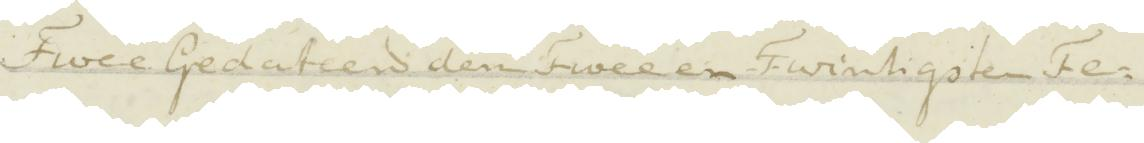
Twee Gedateerd den Twee en Twintigsten Fe„
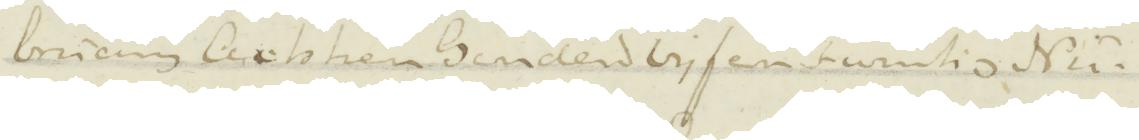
bruary Achtien honderd Vijf en Twintig Nu„
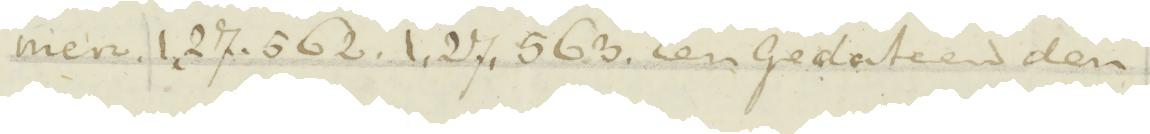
mero 1,27,562, 1,27,563. Een Gedateerd den
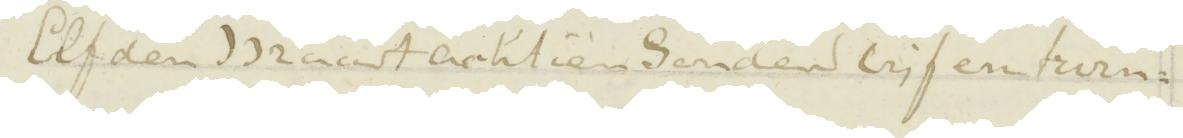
Elfden Maart Achtien honderd vijf en twin„
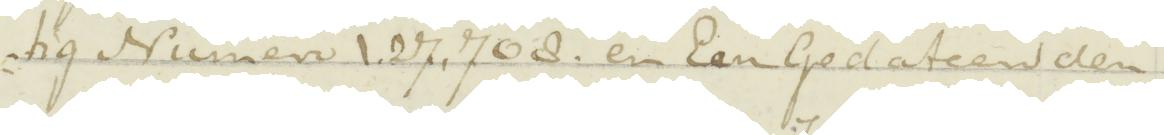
„tig Numero 1,27,708, en Een Gedateerd den
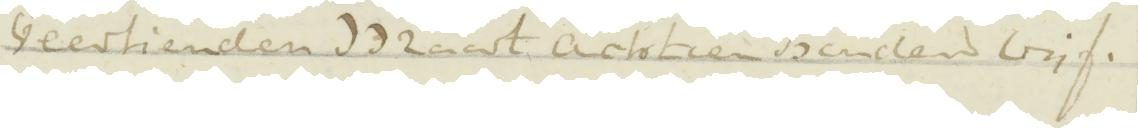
Veertienden Maart Achtien honderd Vijf„
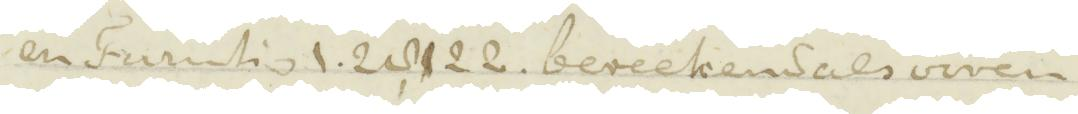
en Twintig 1,28,122. bereekend als vooren
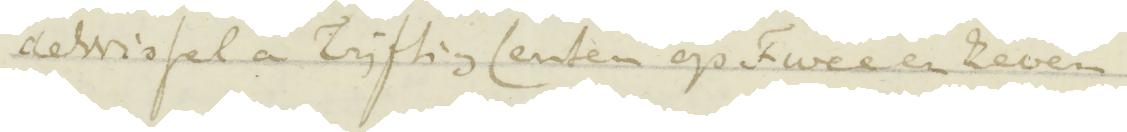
de Wissel a Vijftig Centen op Twee en zeven
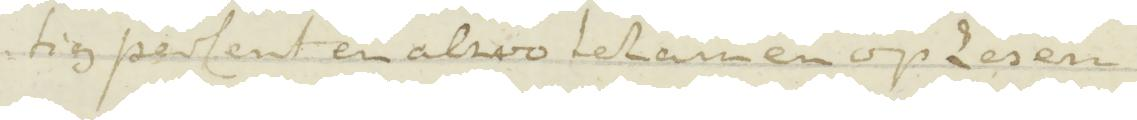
„tig percent en alzoo tezamen op zes en
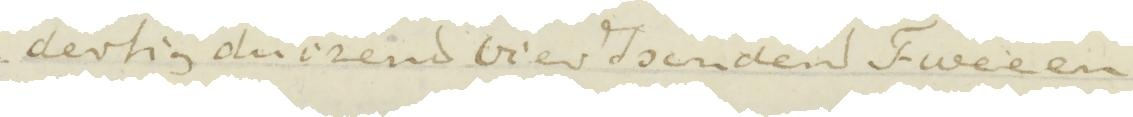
dertig duizend vier Honderd Twee en
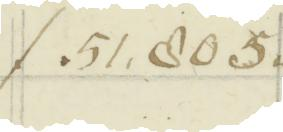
ƒ 51.805
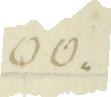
00„
